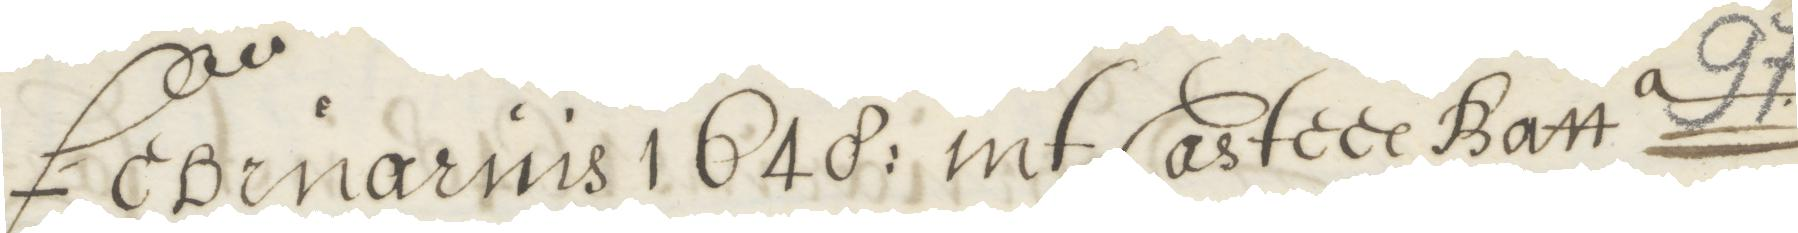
Februarius 1648: int Casteel Batt=a. 97
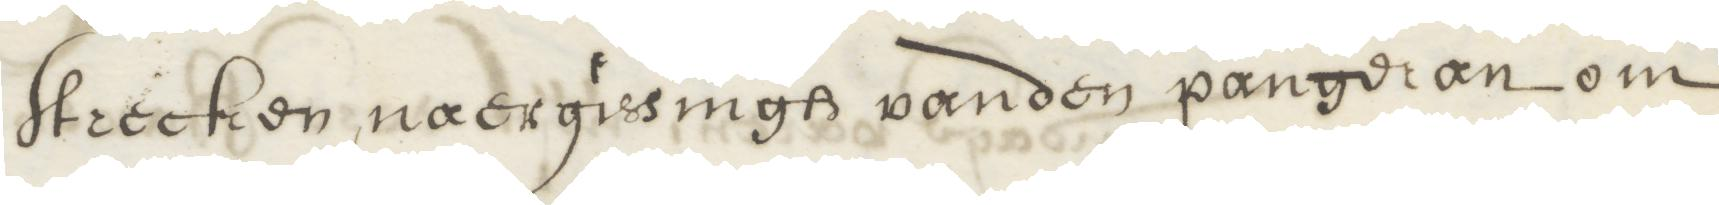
strecken naergissingh van den pangeran om
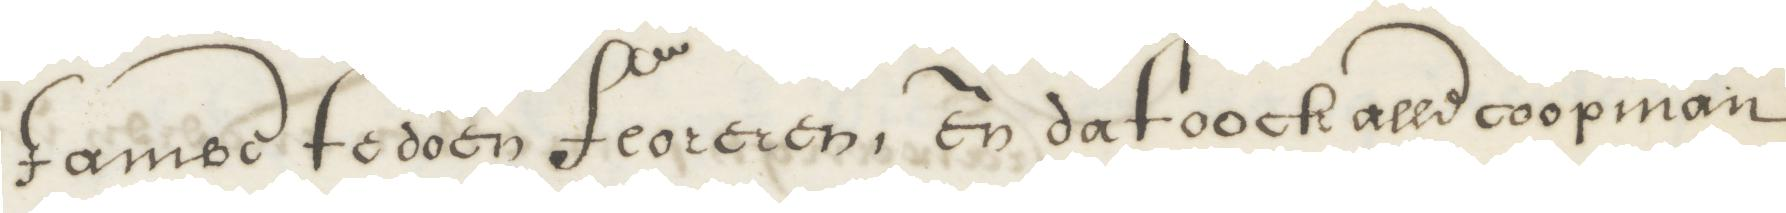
Jambe te doen floreren, en dat oock alle coopman
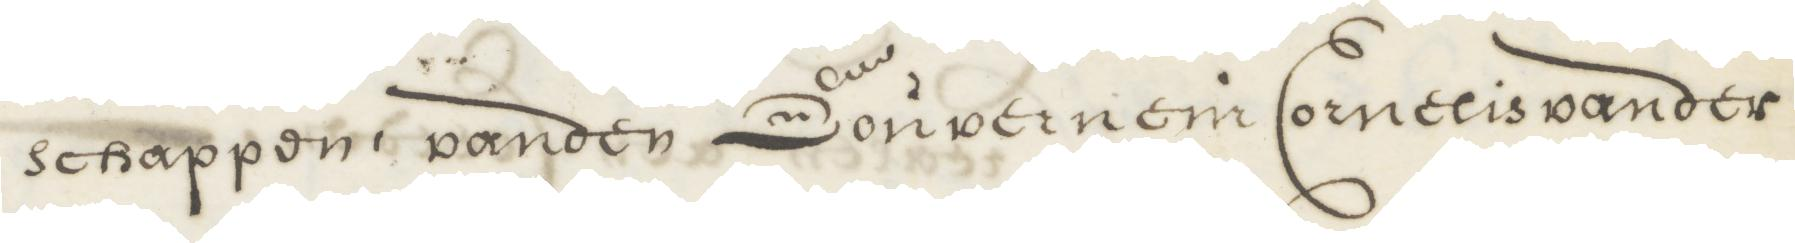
schappen, vanden Gouverneur Cornelis van der
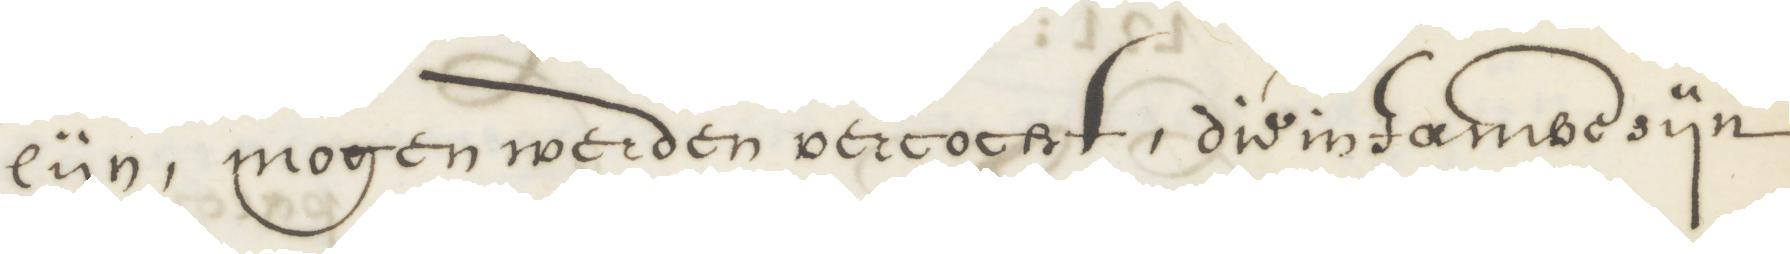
lijn, mogen werden vercocht, die in Jambe sijn
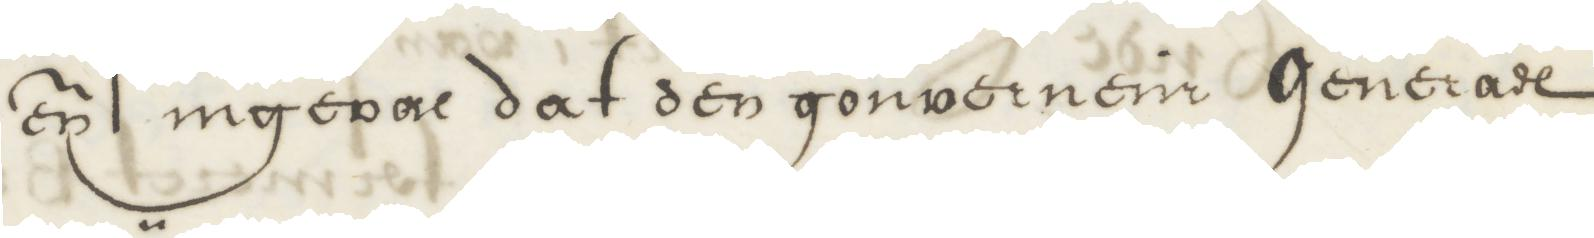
en ingeval dat den gouverneur generael
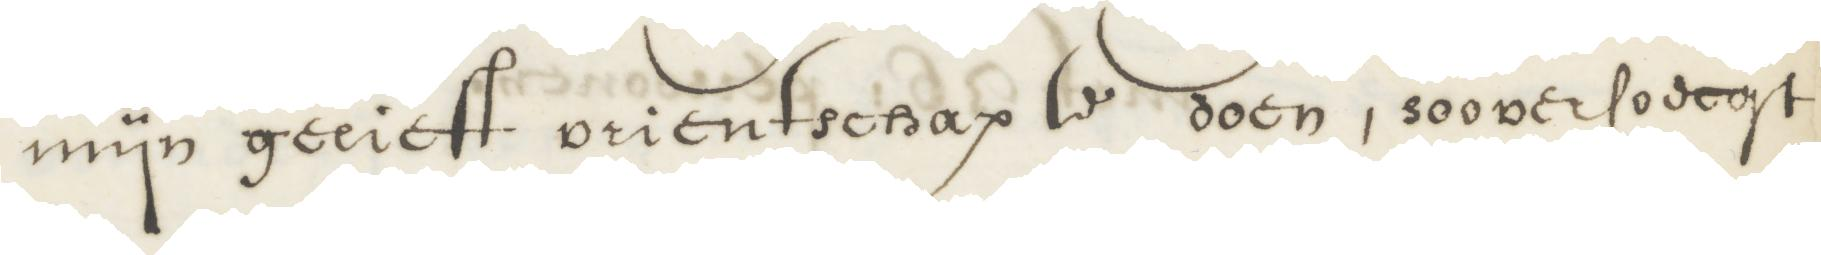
mijn gelieft vrientschap te doen, soo versoecqt
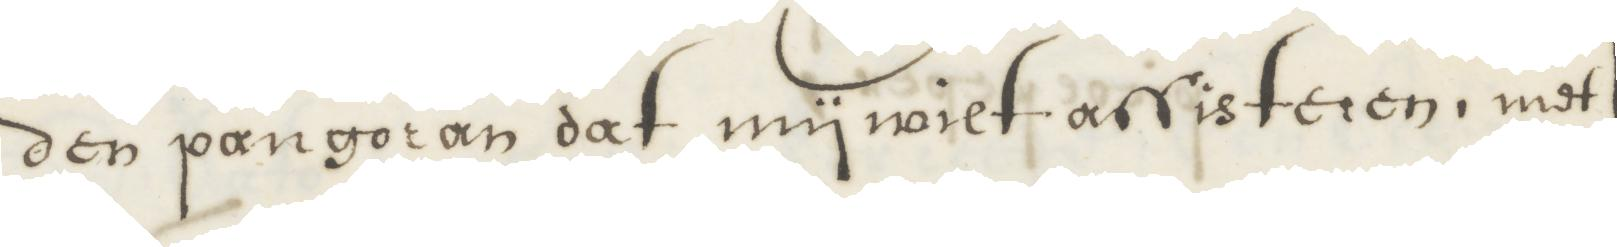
den pangoran dat mij wilt assisteren, met
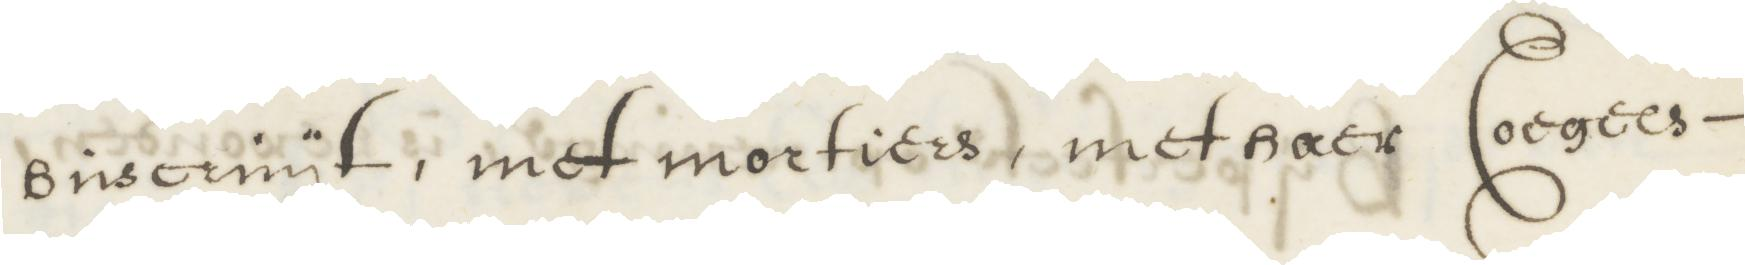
buscruijt, niet mortiers, met haer coegels
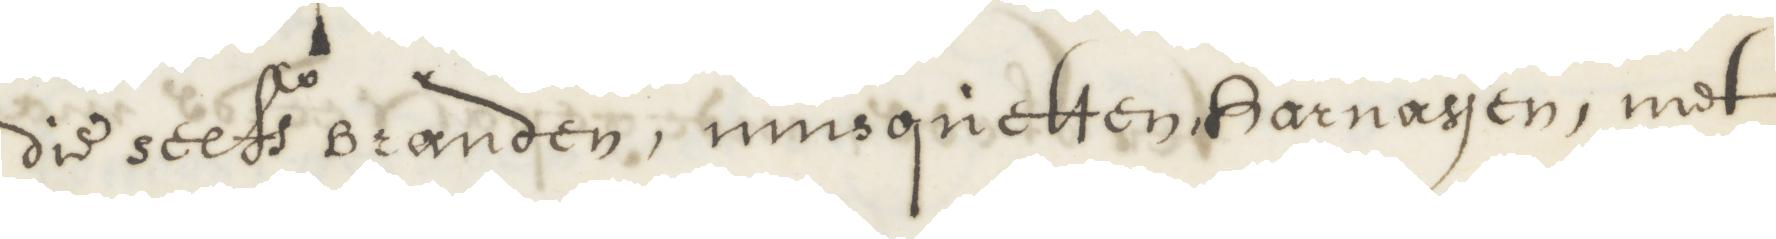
die selfs branden, musquetten, harnasjen, met
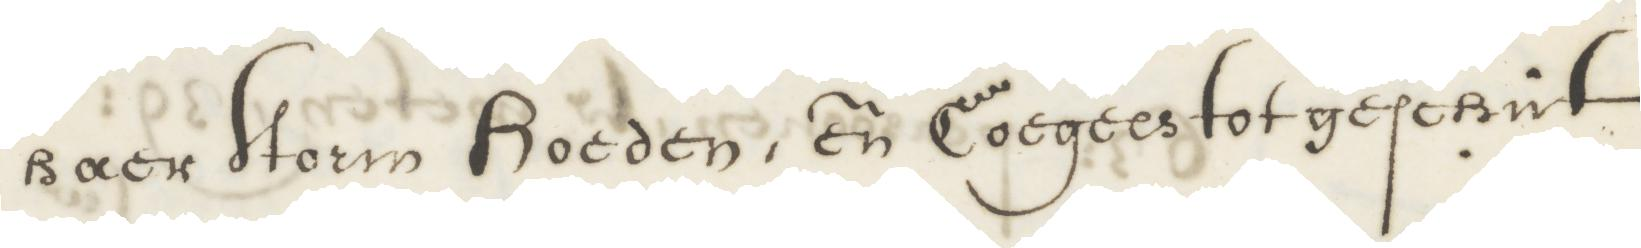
haer storm hoeden, en Coegels tot geschut
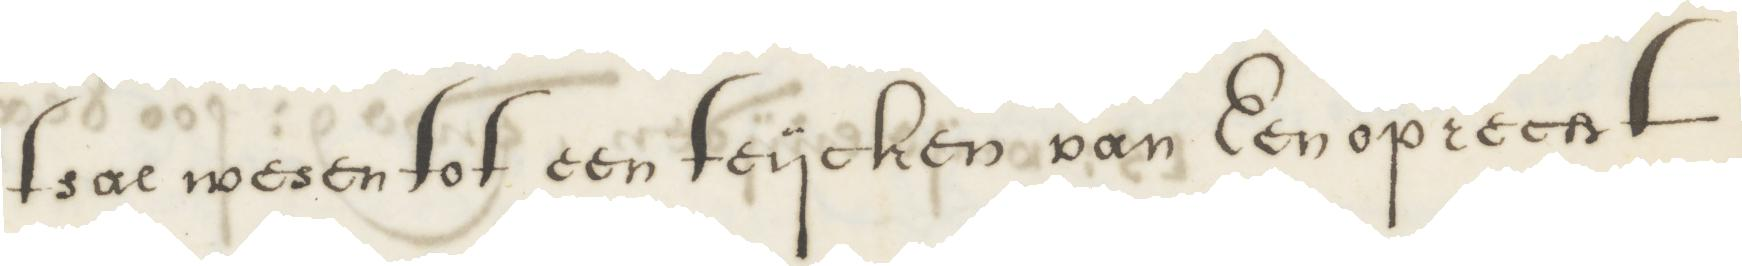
't sal wesen tot een teijcken van Een oprecht
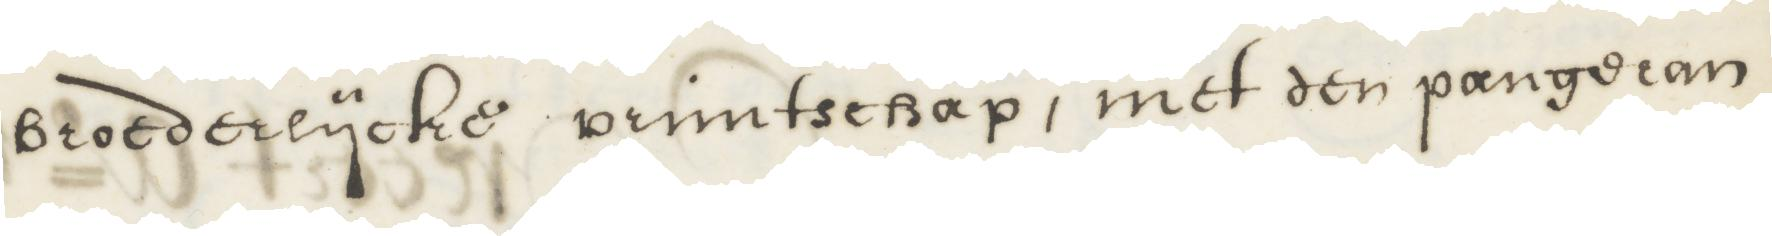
broederlijcke vruntschap, met den pangeran
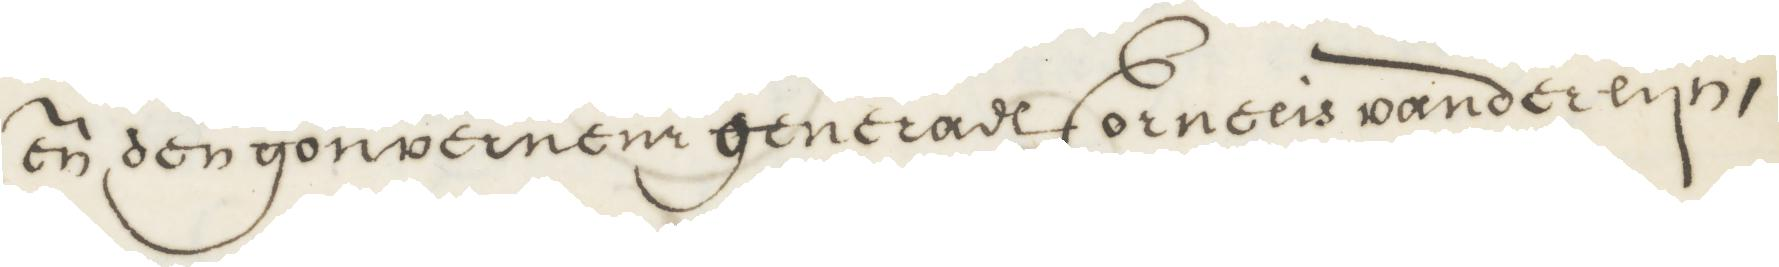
en den gouverneur generael Cornelis van der lijn,
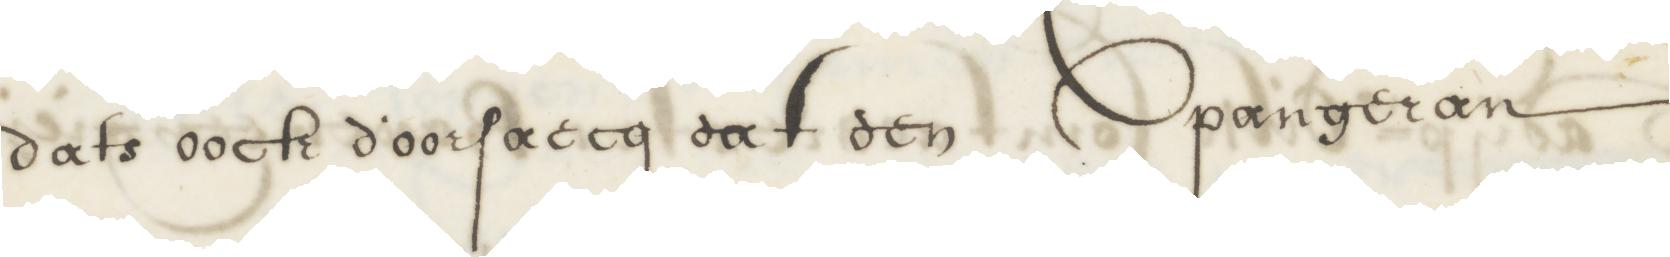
dats oock doorsaecq dat den pangeran
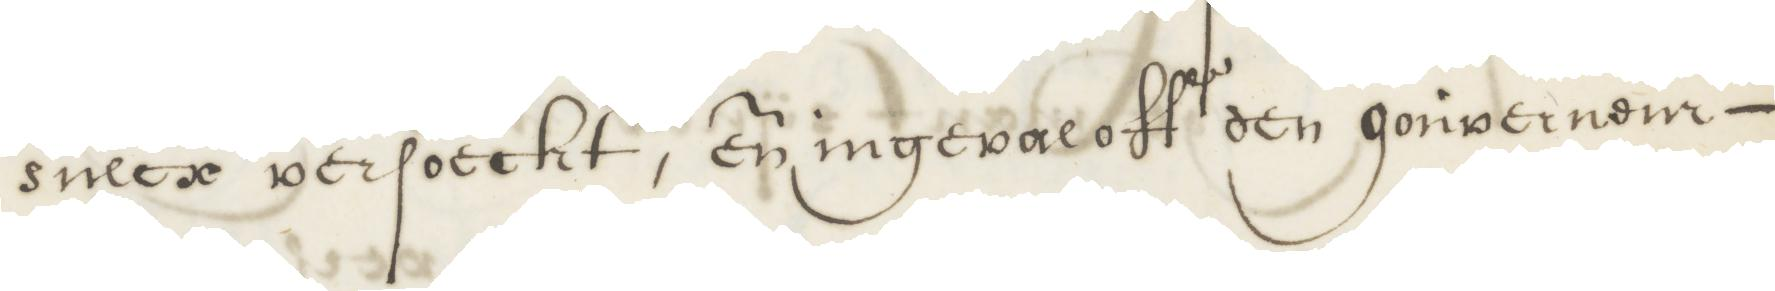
sulcx versoeckt, en ingeval off den gouverneur
